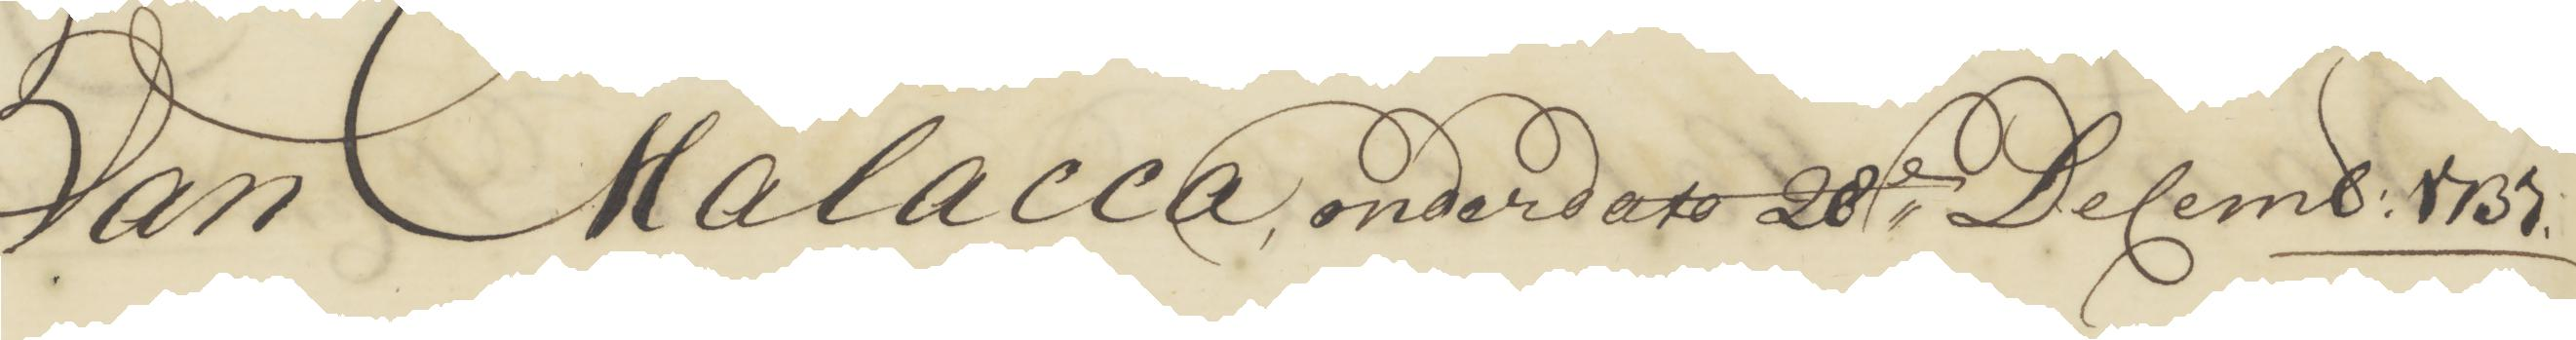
Van Malacca, onderdato 28„en Decemb: 1737.
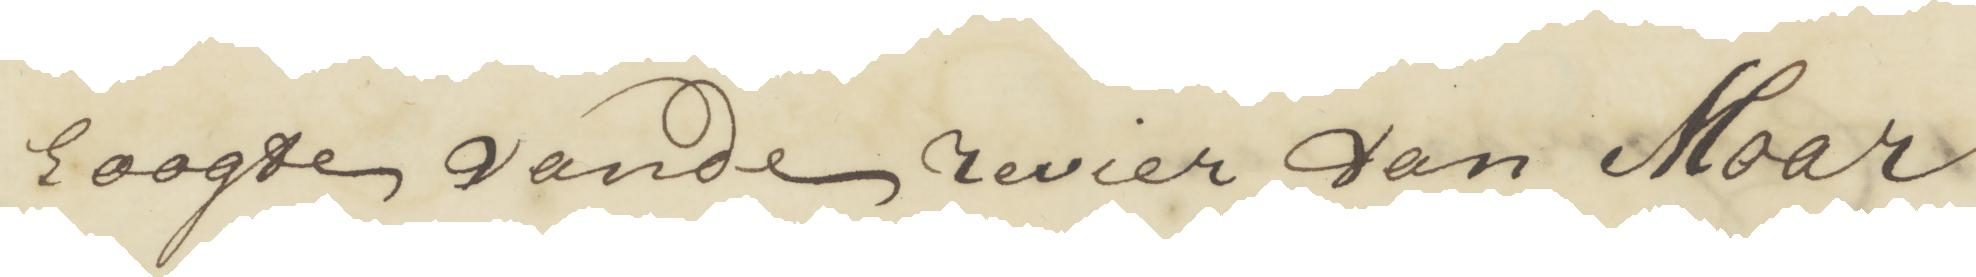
hoogte vande revier van Moar
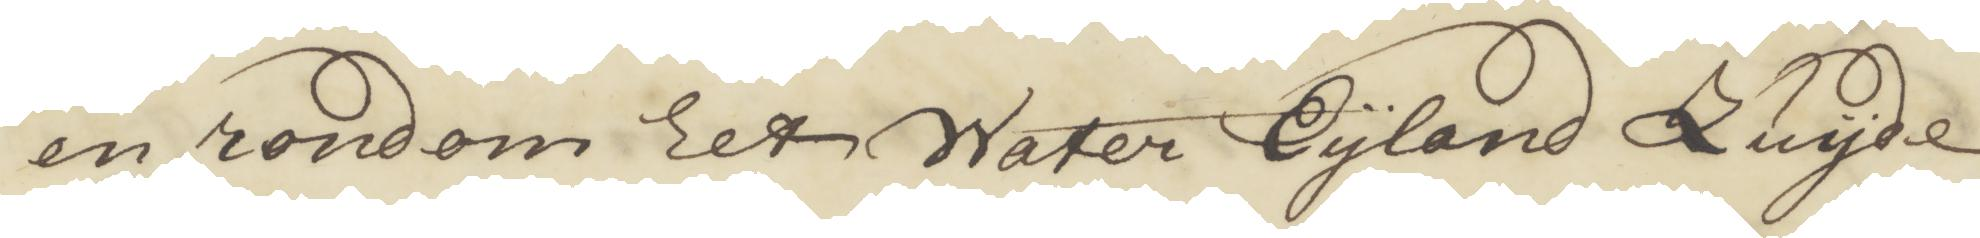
en rondom het water Eijland zuijde
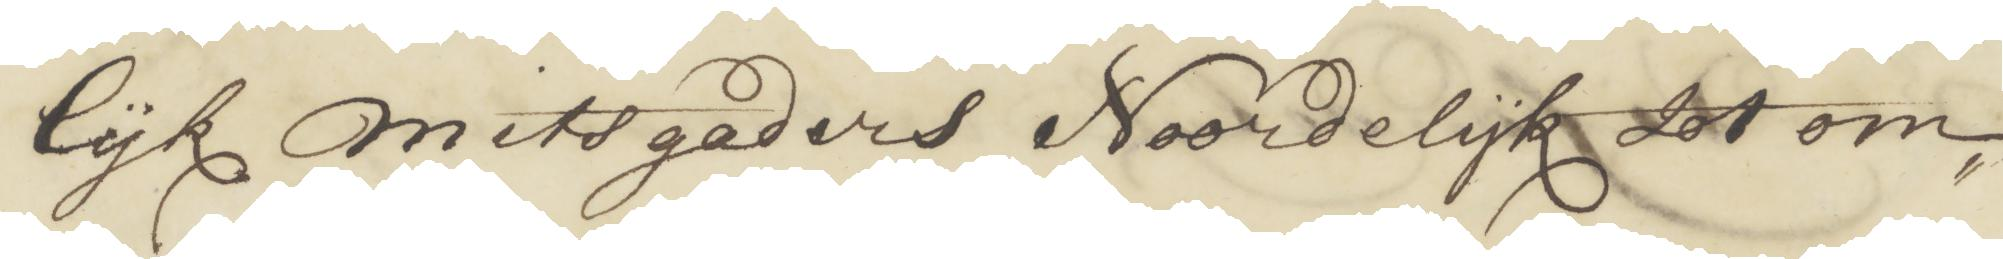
lijk mitsgaders Noordelijk tot om„
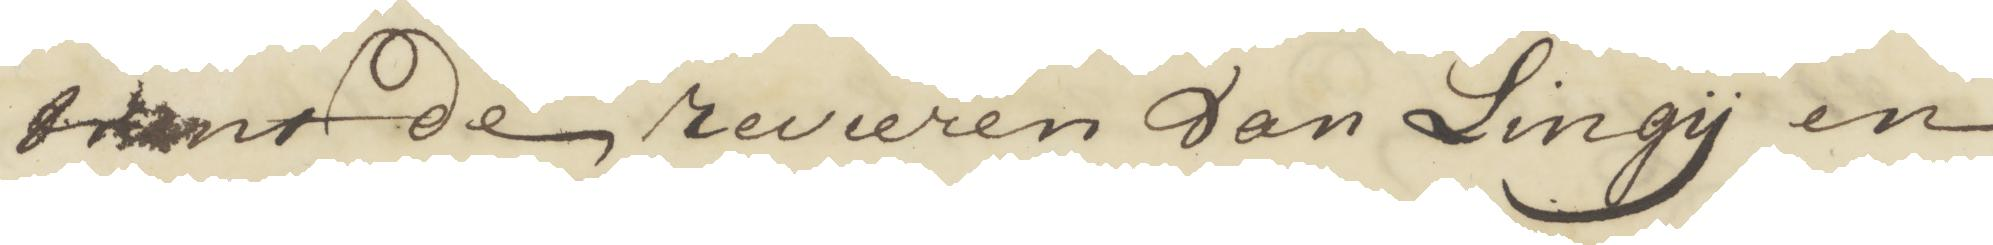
trent de revieren van Lingij en
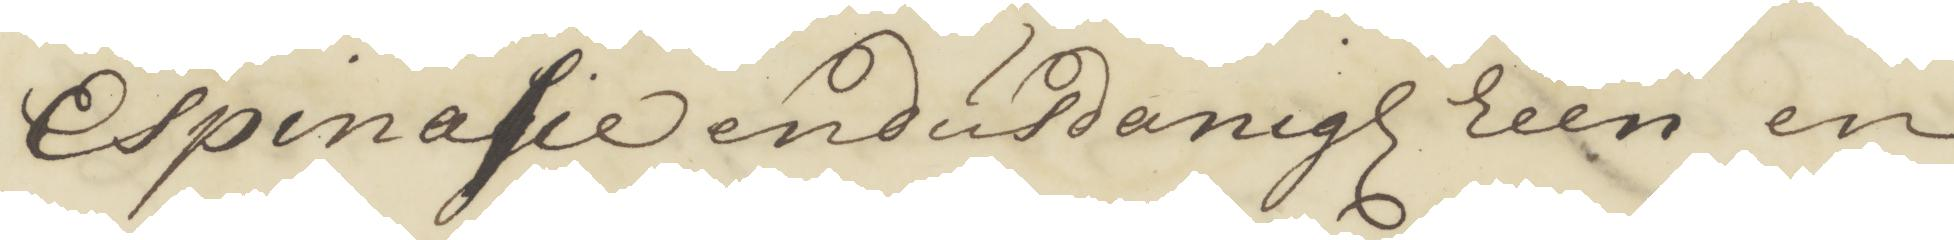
Espinasie endusdanigh heen en
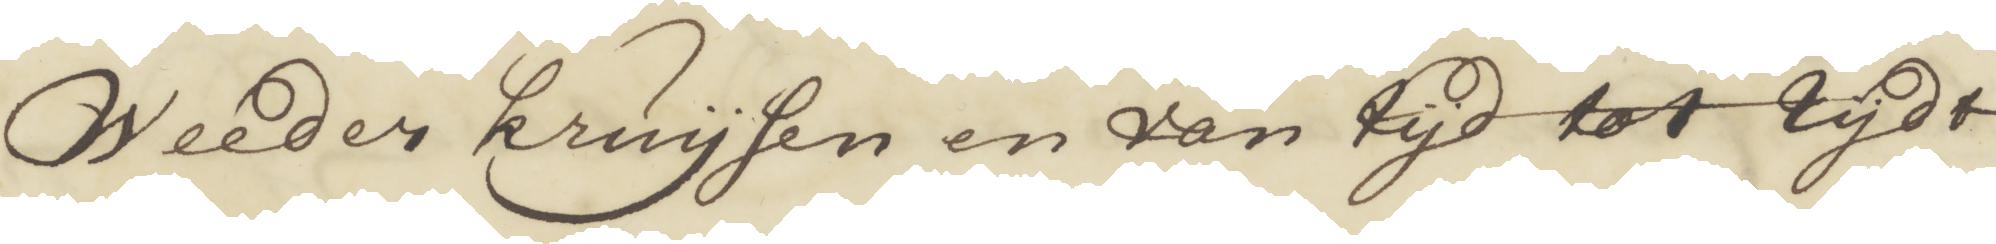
weeder kruijsen en van tijd tot tijdt
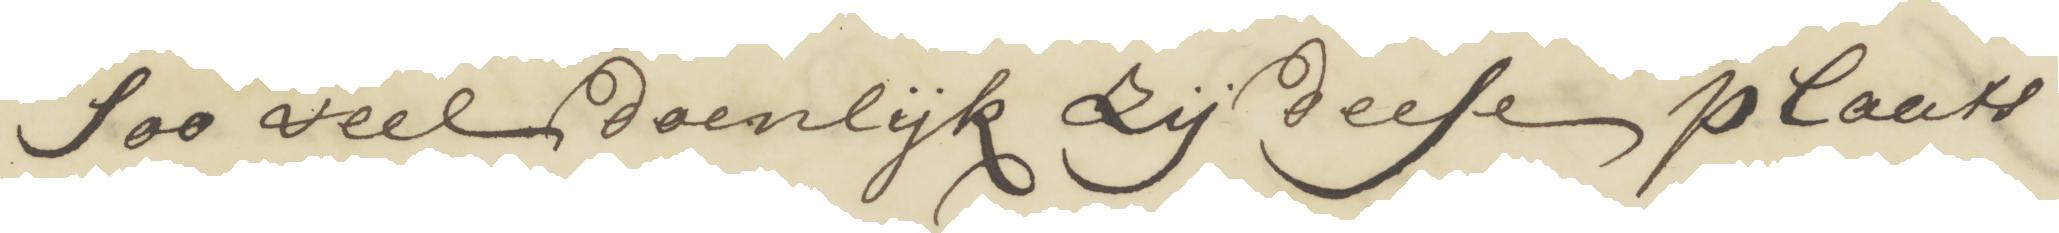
soo veel doenlijk zij deese plaats
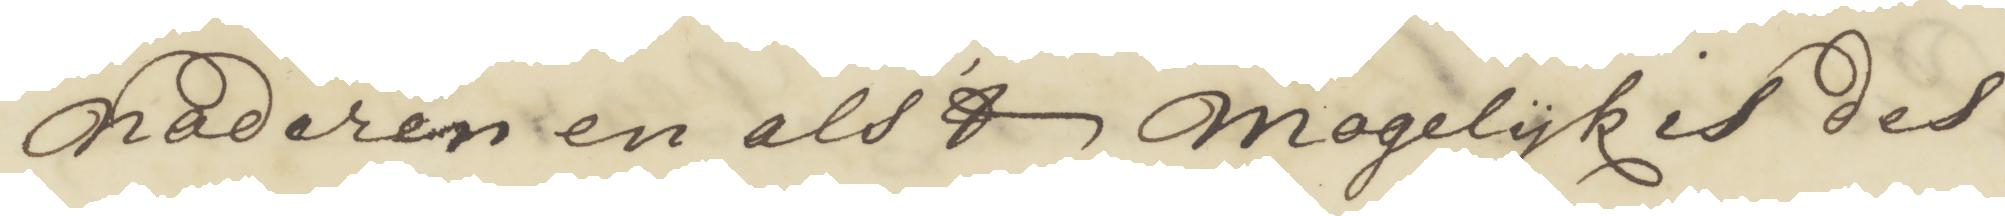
naderen en als 't mogelijk is des
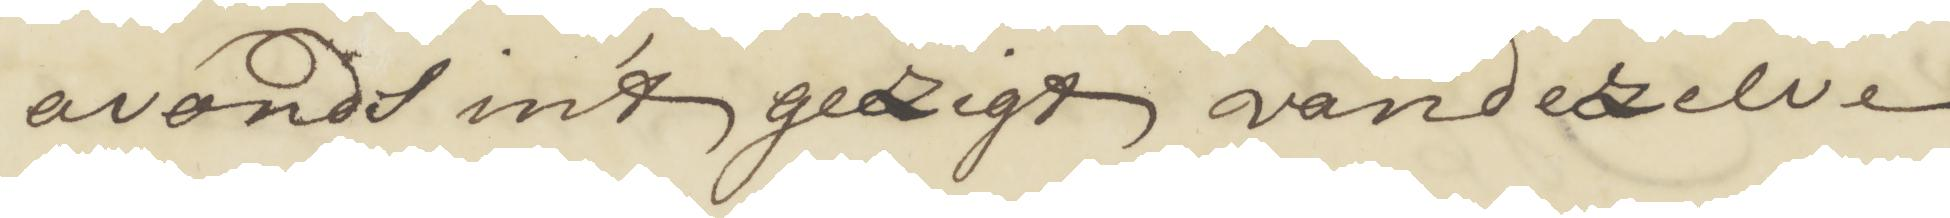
avonds in’t gezigt vandezelve
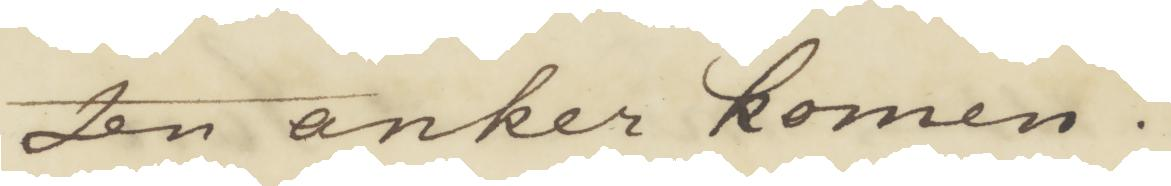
ten anker komen.
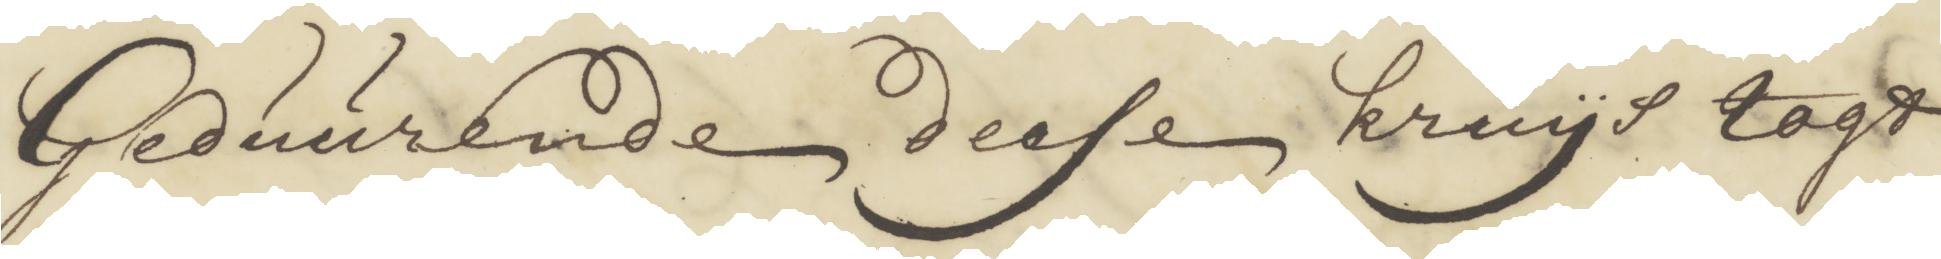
Geduurende deese kruijs togt
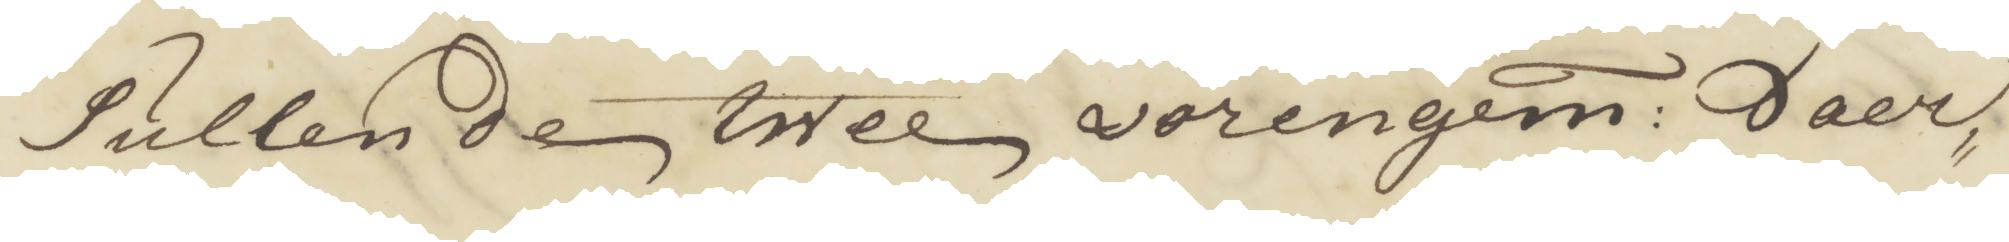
sullen de twee vorengem: vaer„
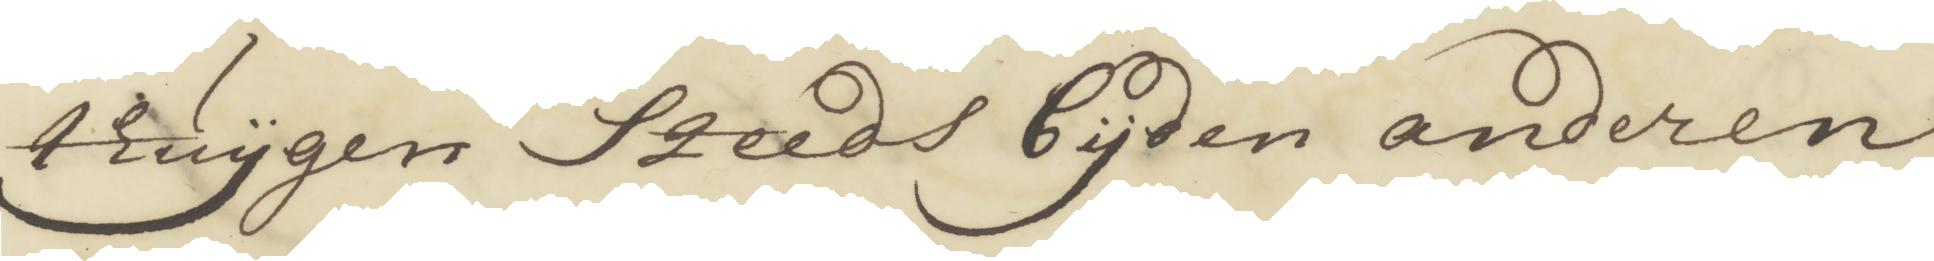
thuijgen steeds bij den anderen
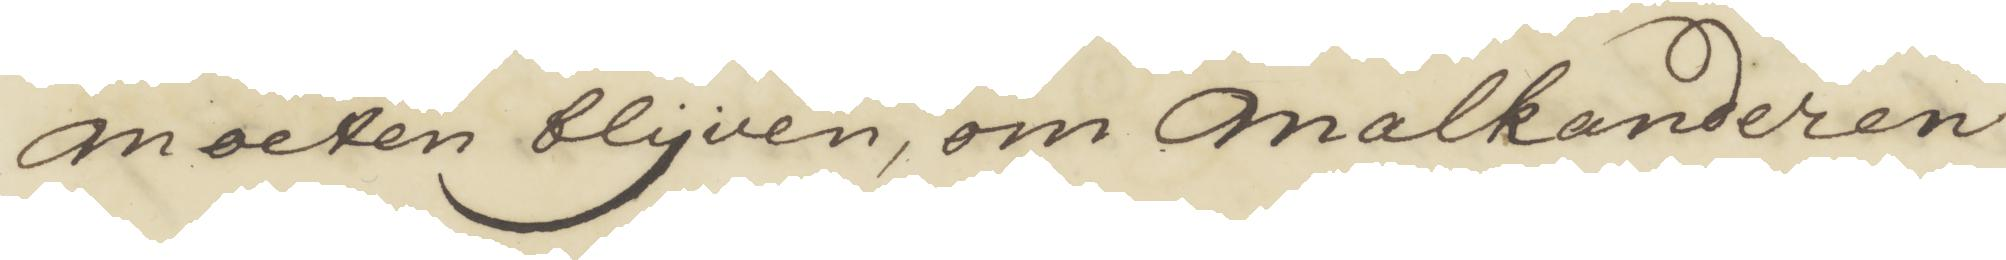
moeten blijven, om malkanderen
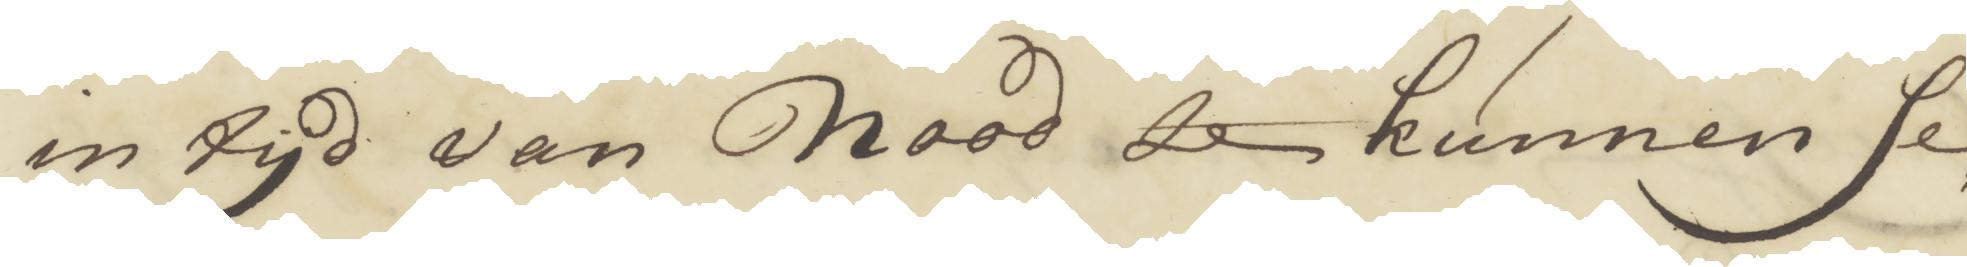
in tijd van nood te kunnen se
